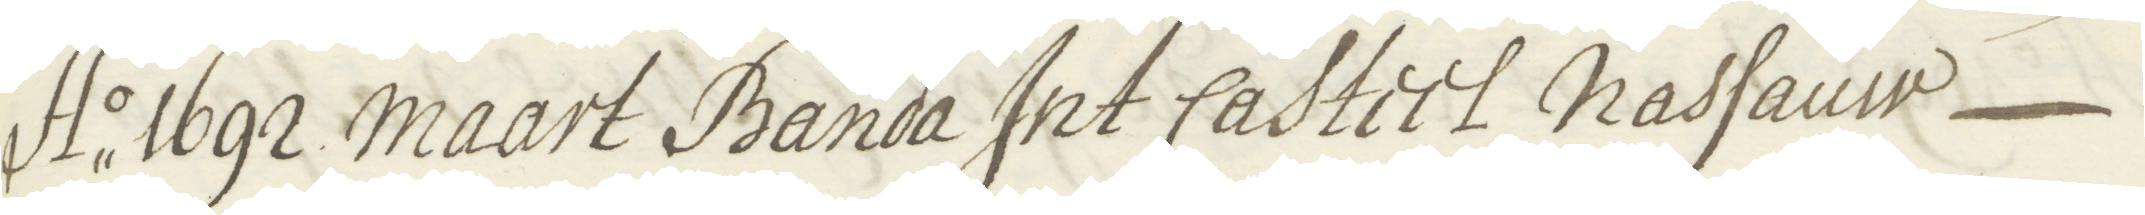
A„o 1692. maart Banda Jnt Casteel nassauw —
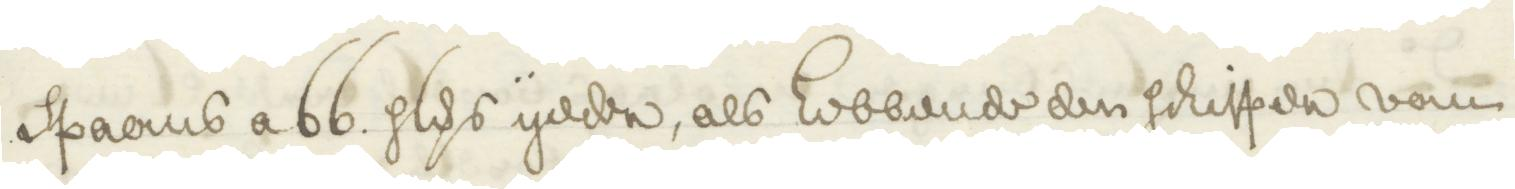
spaans a 66. stvers ijeder, als hebbende den schipper van
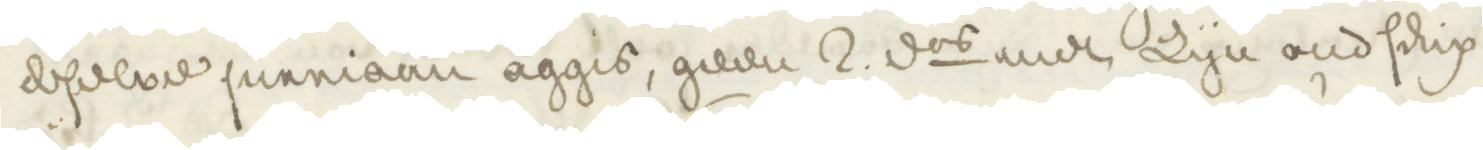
deselve jurriaan aggis, geen 2. d=os met zijn oud schip
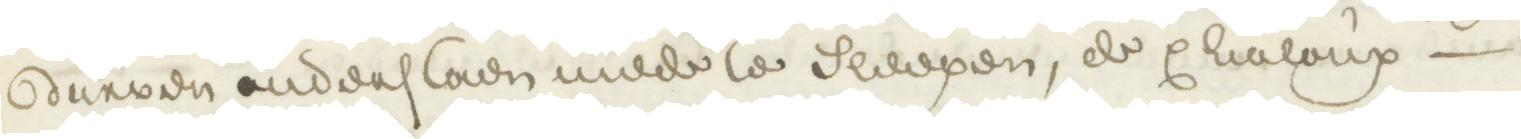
durven onderstaen mede te sleepen, de Chialoup —
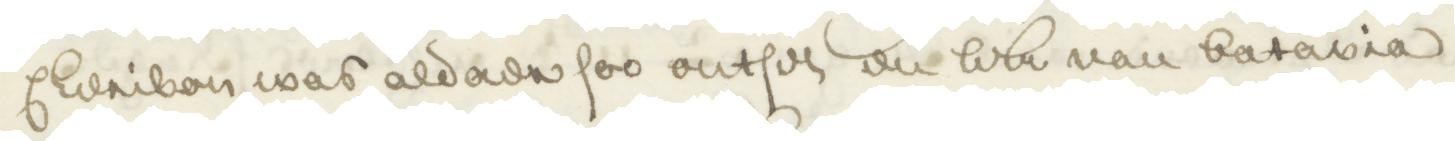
Cheribon was aldaer soo ontset en lek van batavia
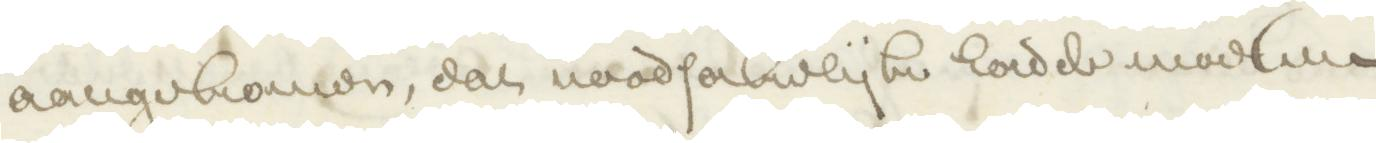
aangekomen, dat noodsakelijk hadde moeten
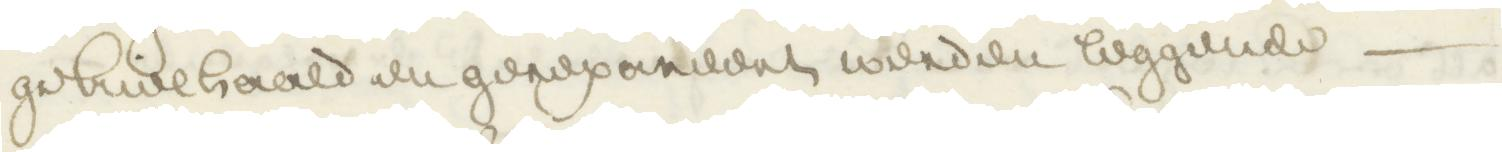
gekielhaald en gerepareert werden leggende —
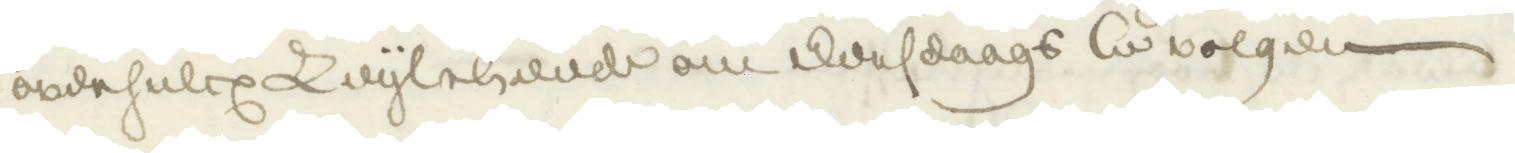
oversulcx zeijl rheede om eersdaags te volgen
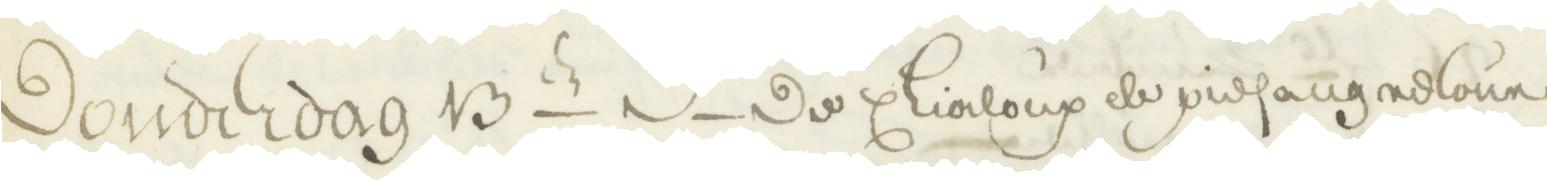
Donderdag 13=en d=o de Chialoup de piesang retour
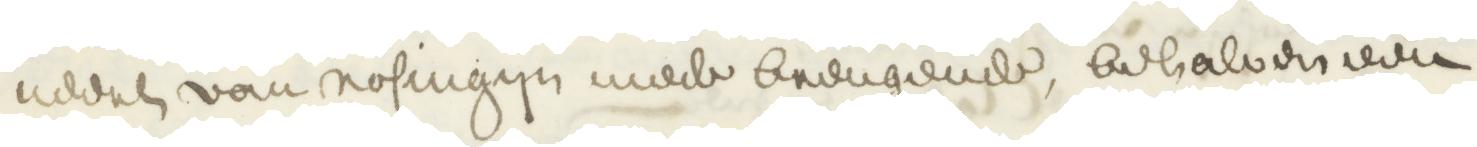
keeren van rosingijn mede brengende, behalven een
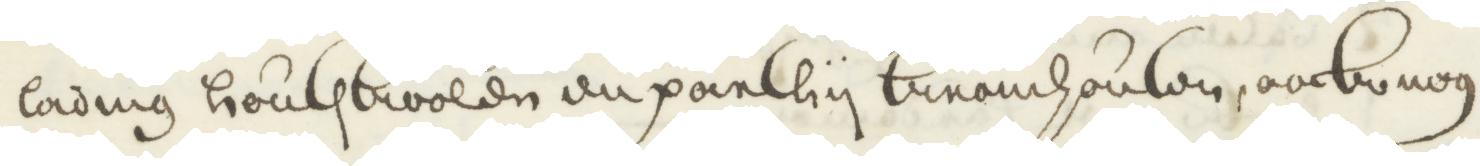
lading houtskoolen en parthij kromhouten, oock nog
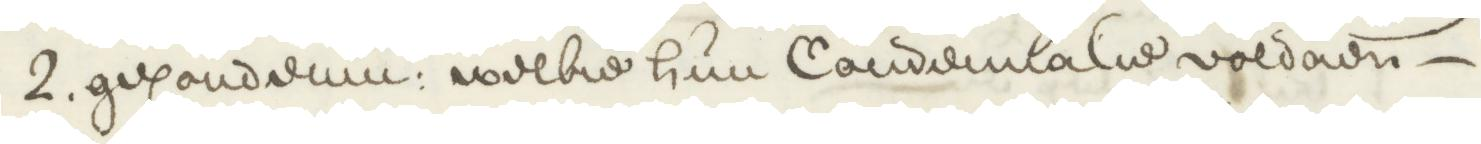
2. gecondenm:e welke hun Condennatie voldaen —
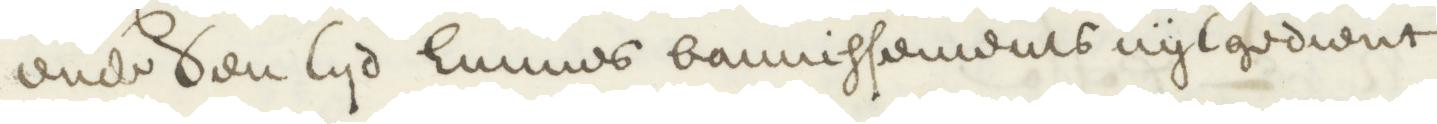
ende den tijd hunnes bannissements uijtgedient
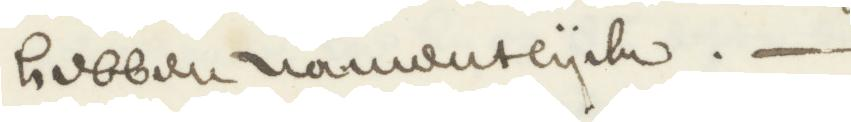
hebben namentlijck. —
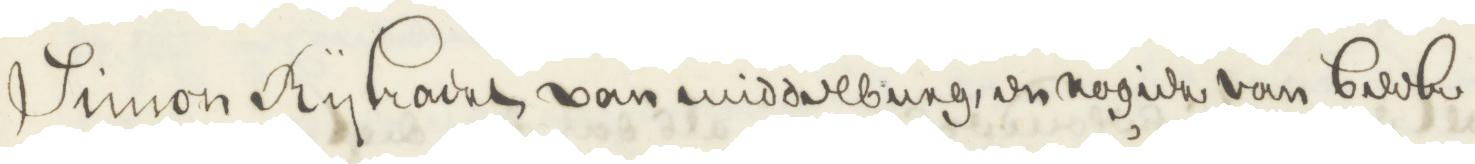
Simon Rijkaert van middelburg, en rogier van beek
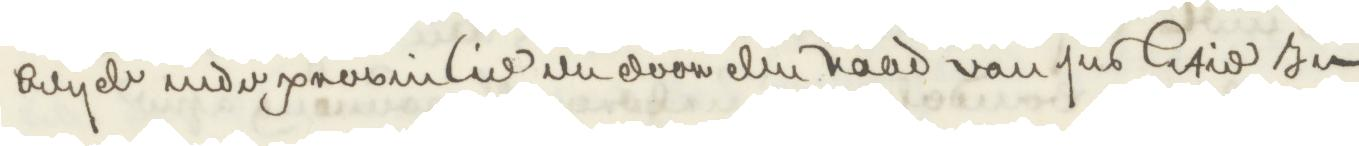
beijde inde provintie en door den raad van justitie In
